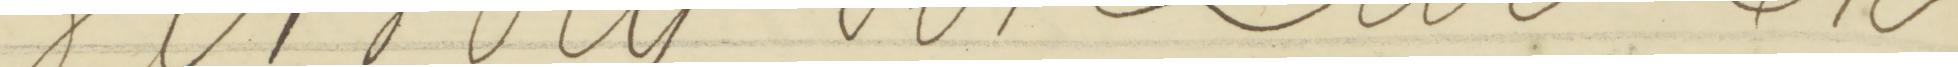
Vervolg der Ziel En
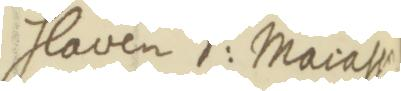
slaven V: Macass:
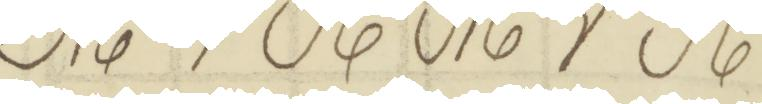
M V K M V K
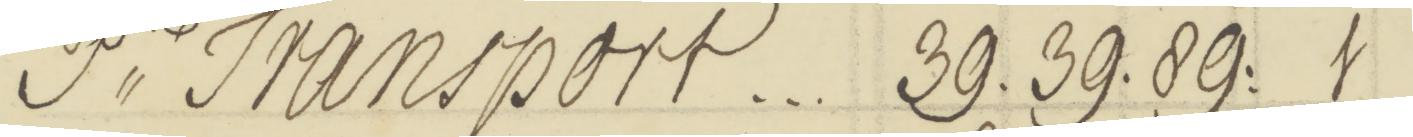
P„r Transport . . . 39. 39. 89: 1
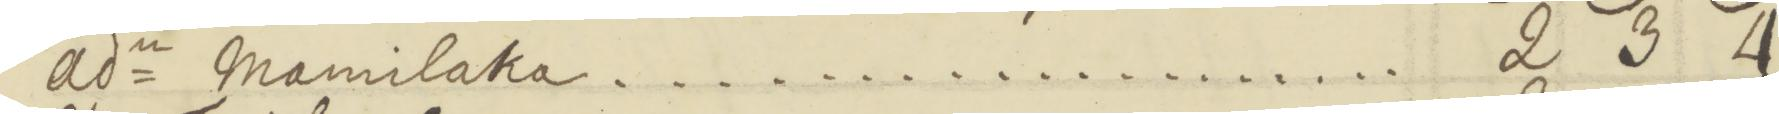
ad=n Mamilaka . . . . . . . . . . . . . . . . . . . 2 3 4
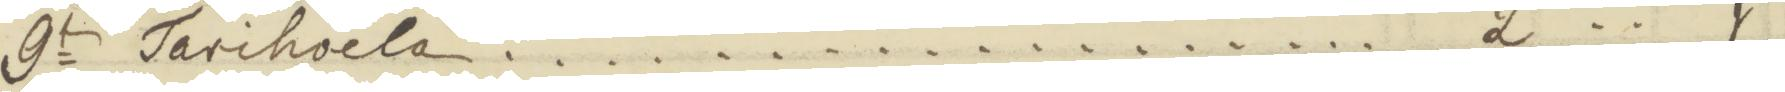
g=t Tarihoela . . . . . . . . . . . . . . . . . . 2 . . 1
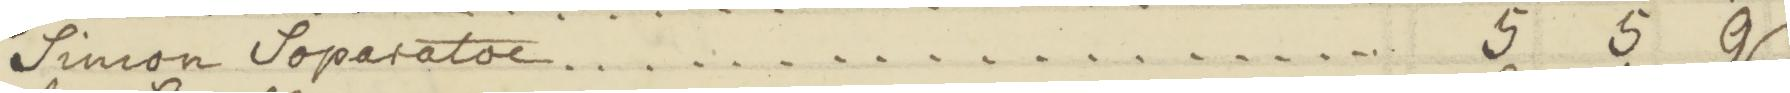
Simon Soparatoe . . . . . . . . . . . . . . . . . . . 5 5 9
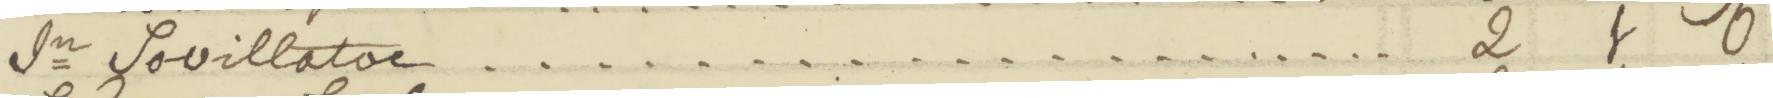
I=n Sovillatoe . . . . . . . . . . . . . . . . . . . . 2 1 6
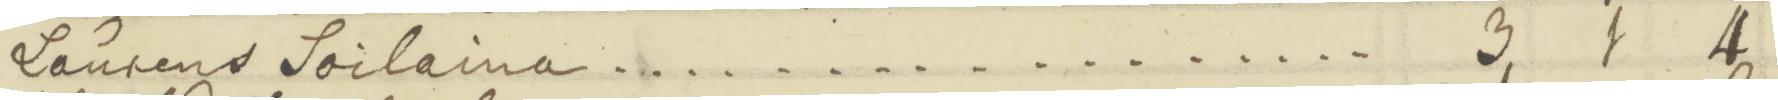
Laurens Soilaina . . . . . . . . . . . . . . . . .3 1 4
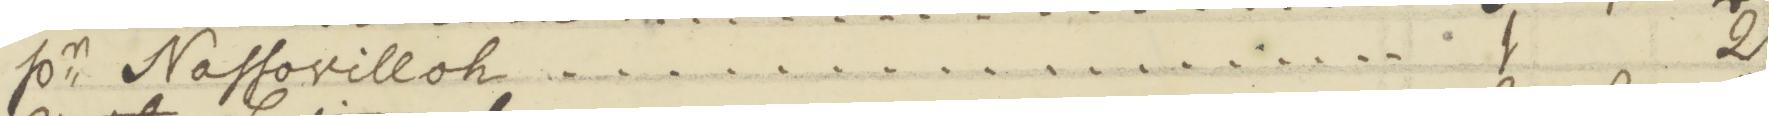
p„r Nassovilloh . . . . . . . . . . . . . . . . . . 1 2
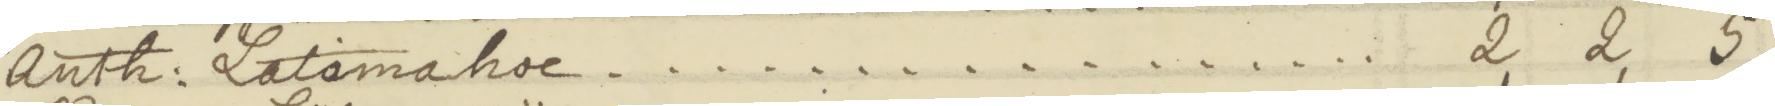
Anth: Latimahoe . . . . . . . . . . . . . . . . 2 2 5
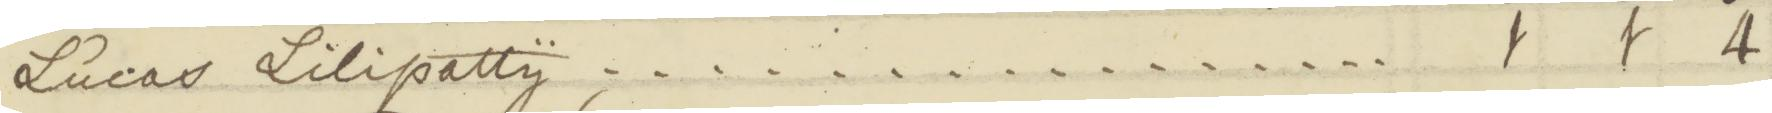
Lucas Lilipattij . . . . . . . . . . . . . . . . 1 1 4
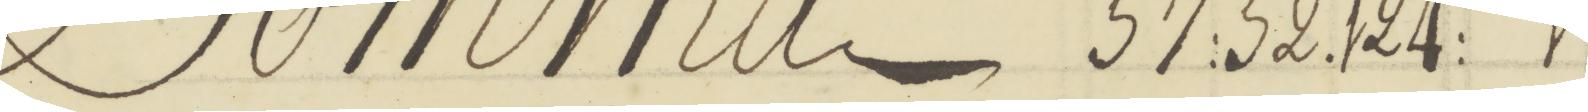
Somma 57:52.124: 1
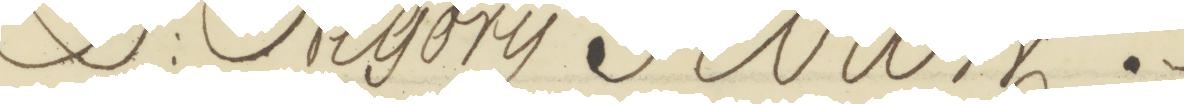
D:' Negorij Tiouw.
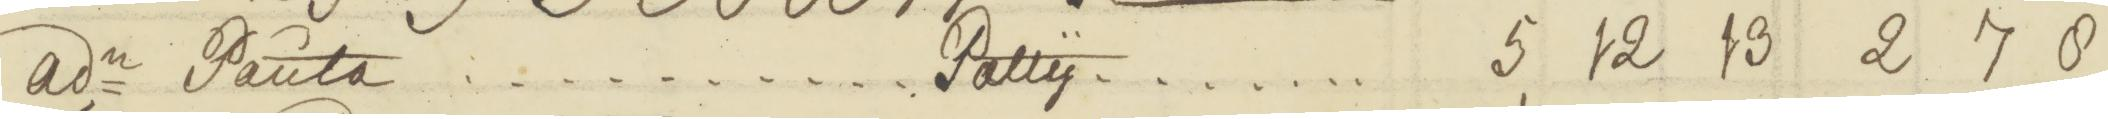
ad=n Pauta . - - - - - - - - - . Pattij . . . . . . . 5 12 13 2 7 8
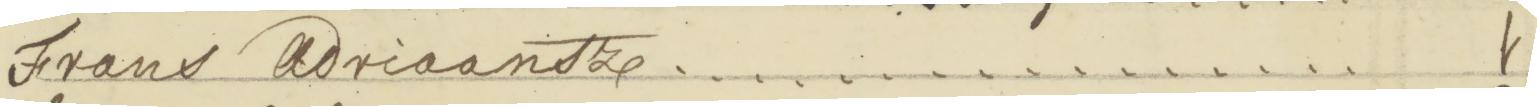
Frans adriaansze . . . . . . . . . . . . . . . . 1
